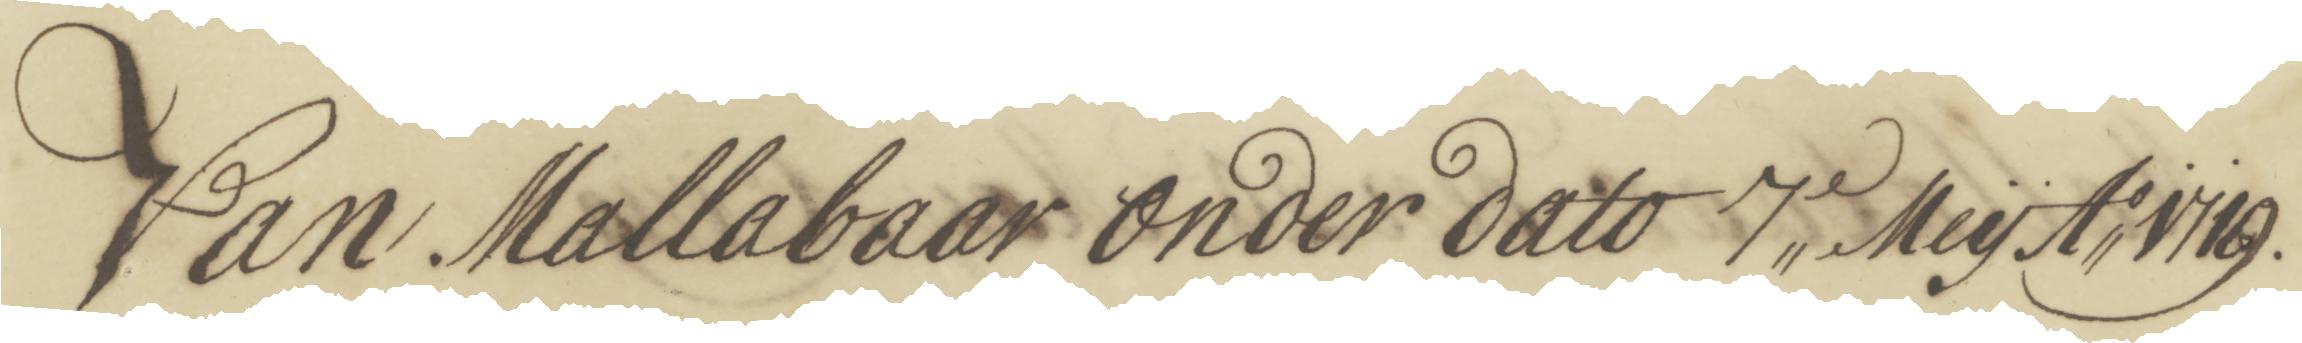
Van Mallabaar onder dato 7„e Meij A„o 1719.
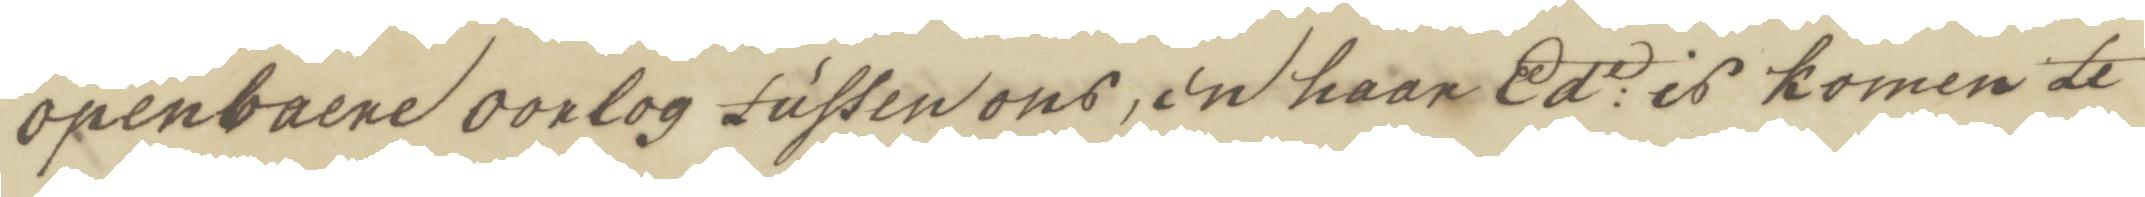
openbaere oorlog tussen ons, en haar Ed:e is komen te
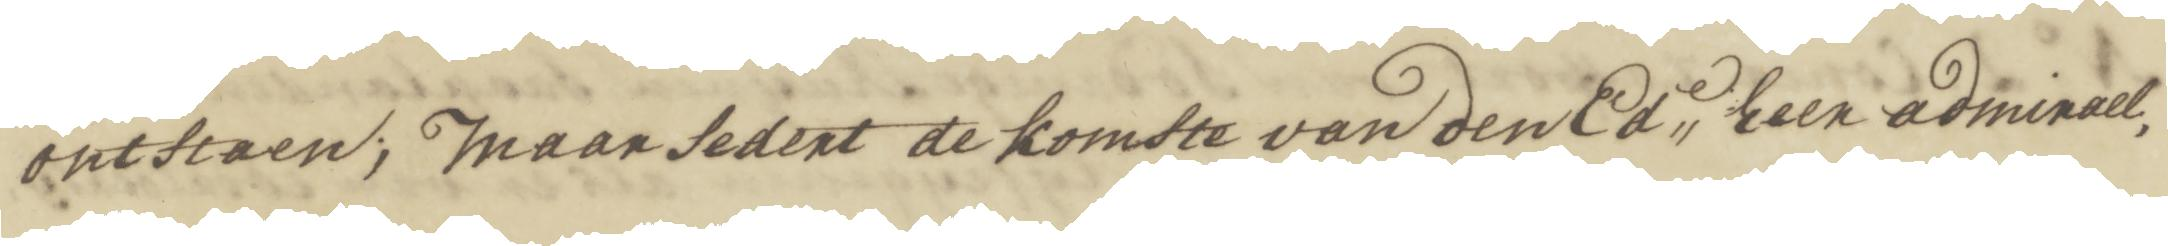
ontstaen; maar sedert de komste van den Ed„e heer admirael,
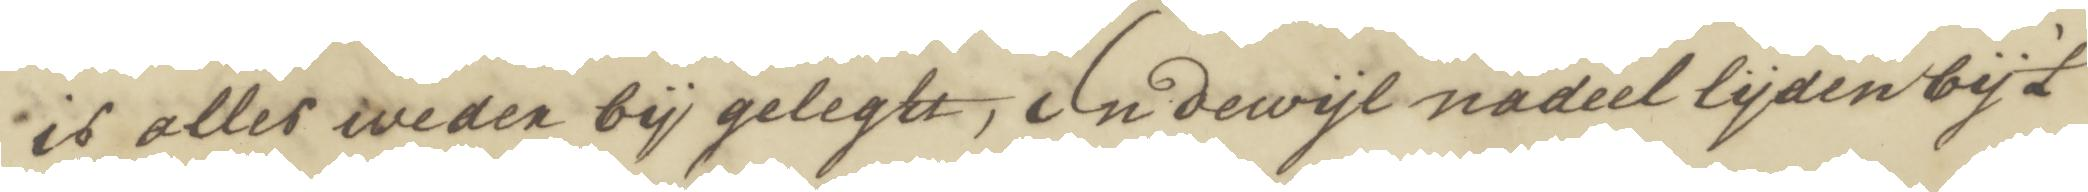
is alles weder bij geleght, En dewijl nadeel lijden bij ’t
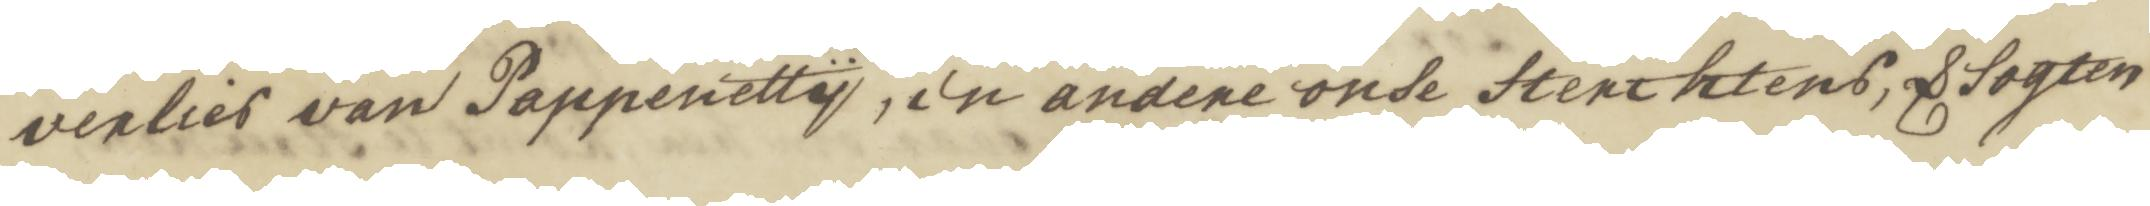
verlies van Pappenettij, en andere onse stercktens, versogten
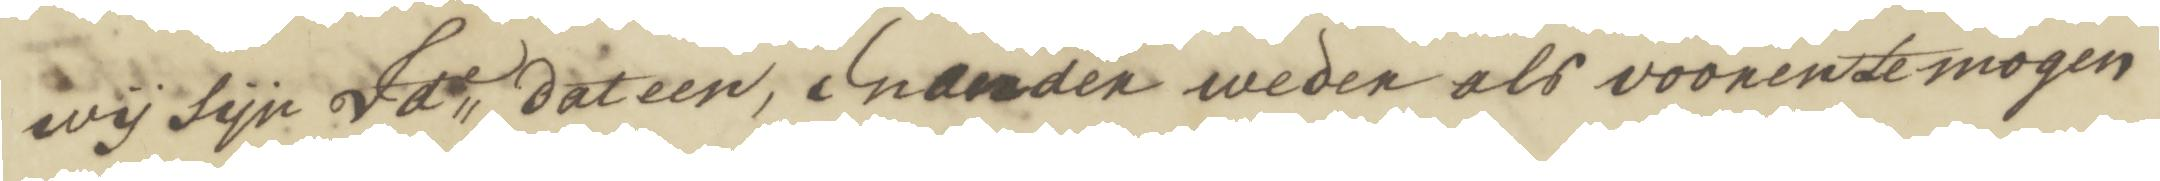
wij sijn Ed„e dat een, en ander weder als vooren te mogen
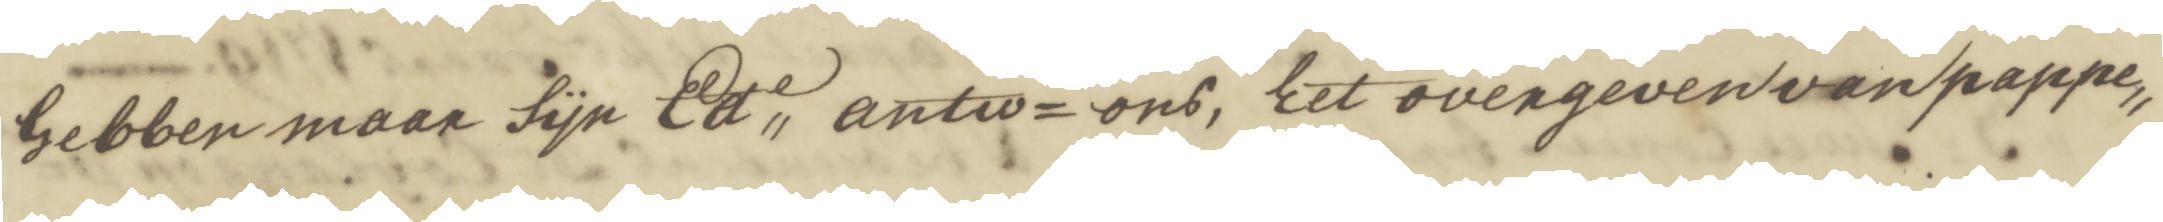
hebben maar sijn Ed„e antw=e ons, het overgeven van pappe„
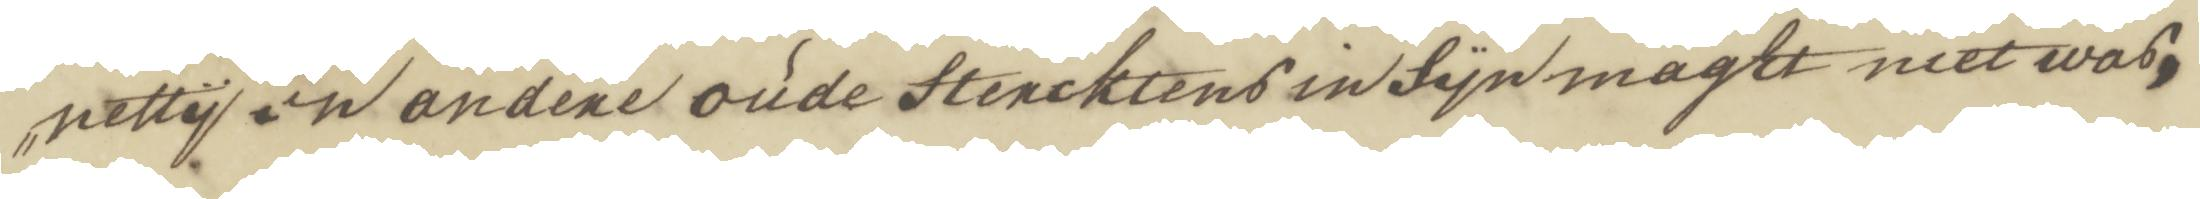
„nettij en andere oude stercktens in sijn maght niet was,
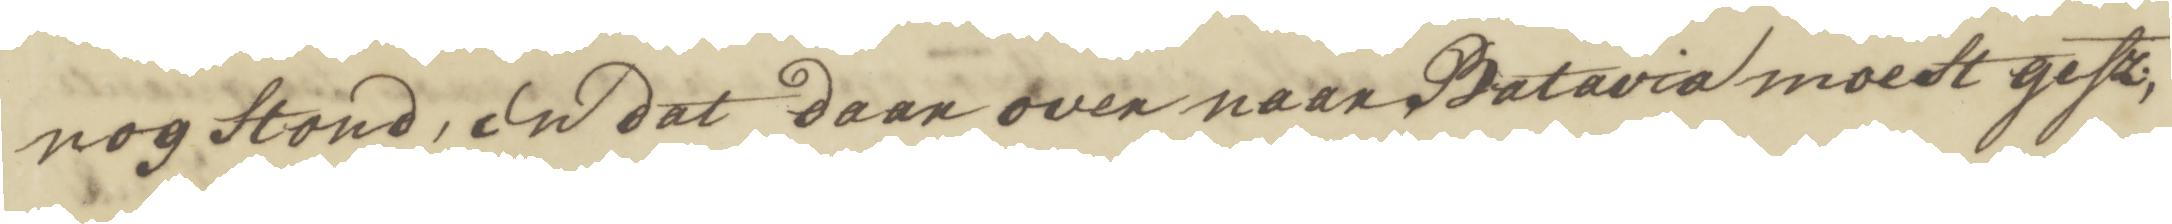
nog stond, en dat daar over naar Batavia moest gesz:,
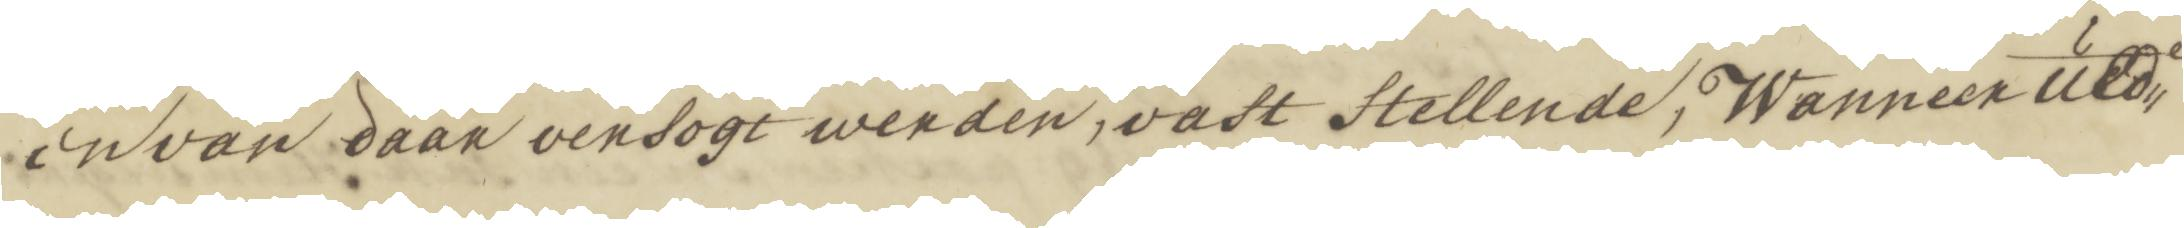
en van daar versogt werden, vast stellende, wanneer UEd„
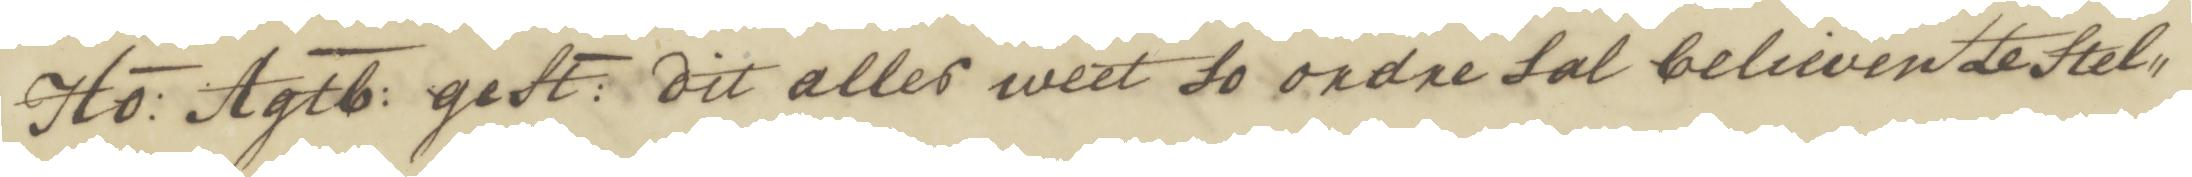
Ho: Agtb: gest: dit alles weet so ordre sal believen te stel„
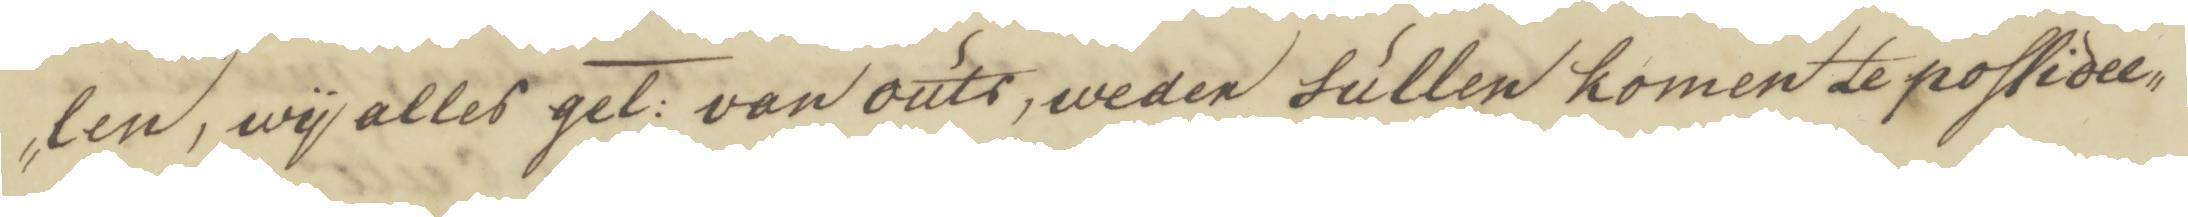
„len, wij alles gelijk van outs, weder sullen komen te possidee„
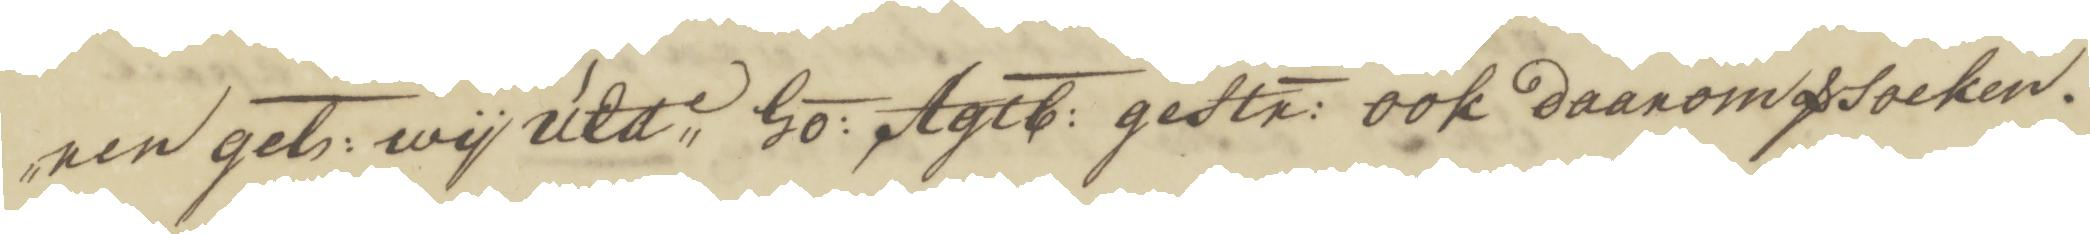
„ren gelijk wij uEd„e ho: Agtb: gestr: ook daarom versoeken.
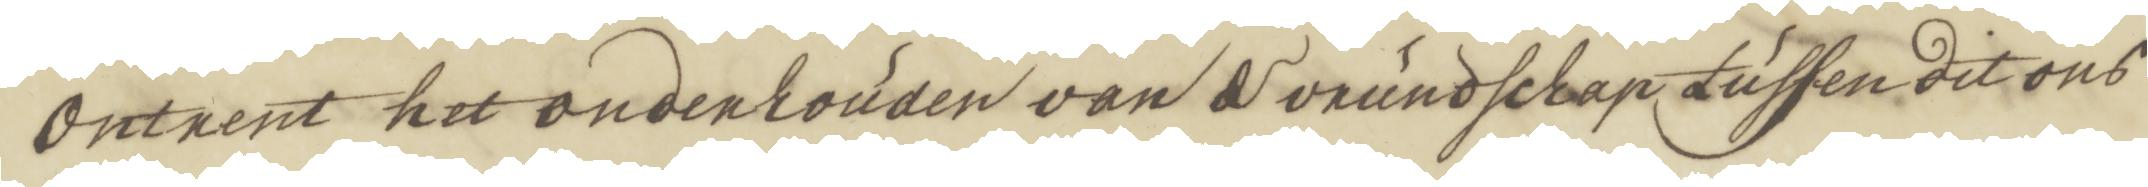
ontrent het onderhouden van de vrundschap tussen dit ons
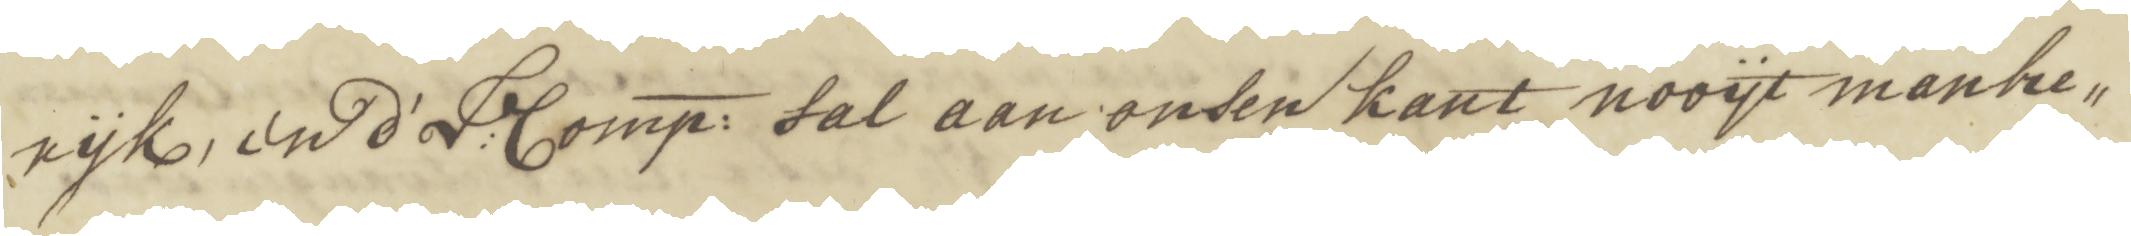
rijk, en d’E:Comp: sal aan onsen kant nooijt manke„
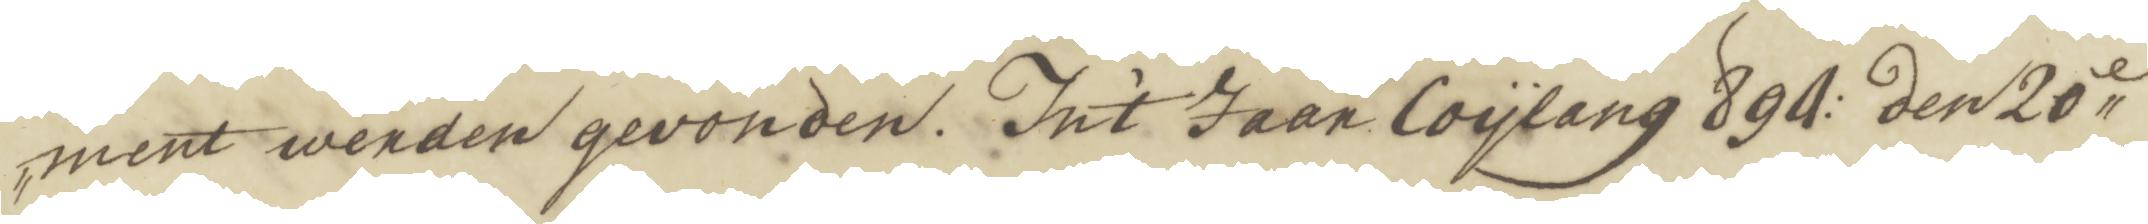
„ment werden gevonden. In’t Iaar Coijlang 894: den 20„e
